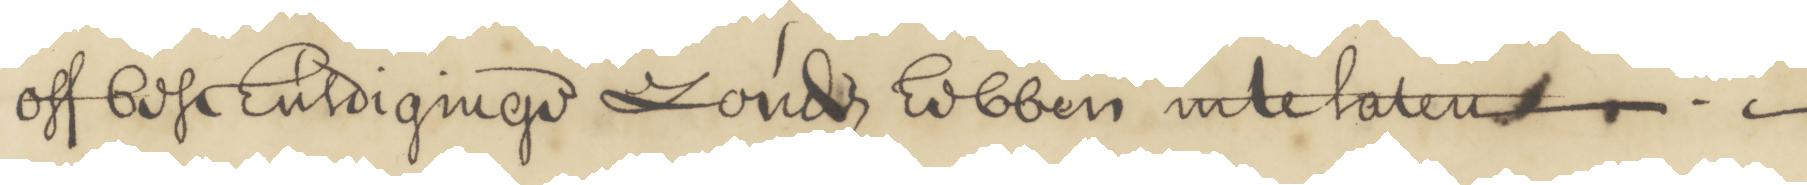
off beschuldiginge zouden hebben intelaten.
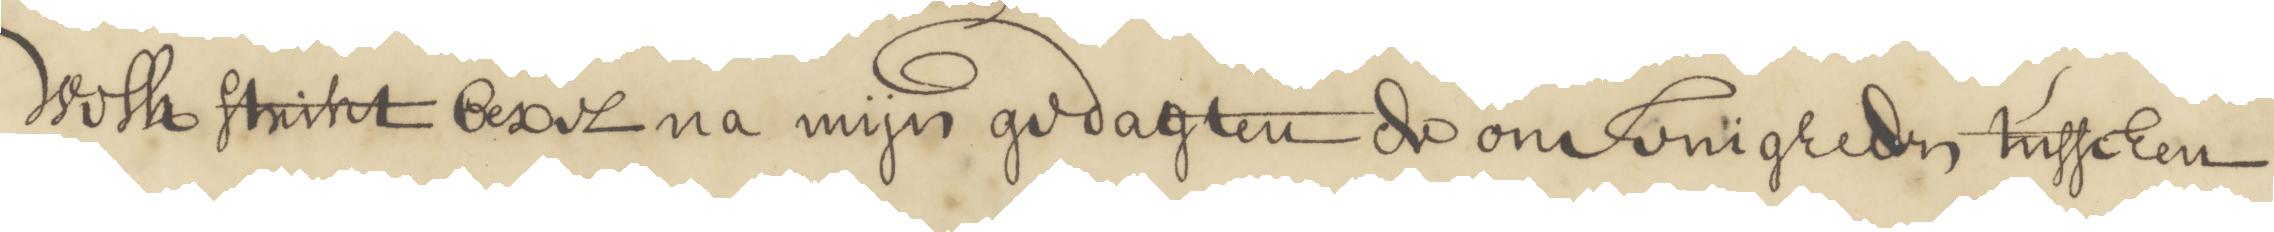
Welk strikt bevel na mijn gedagten de onEenigheden tusschen
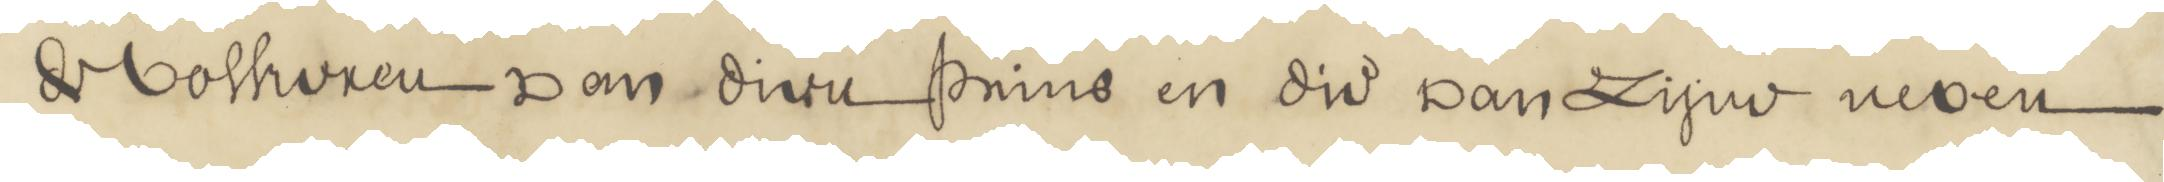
de volkeren van dien prins en die van zijne neven
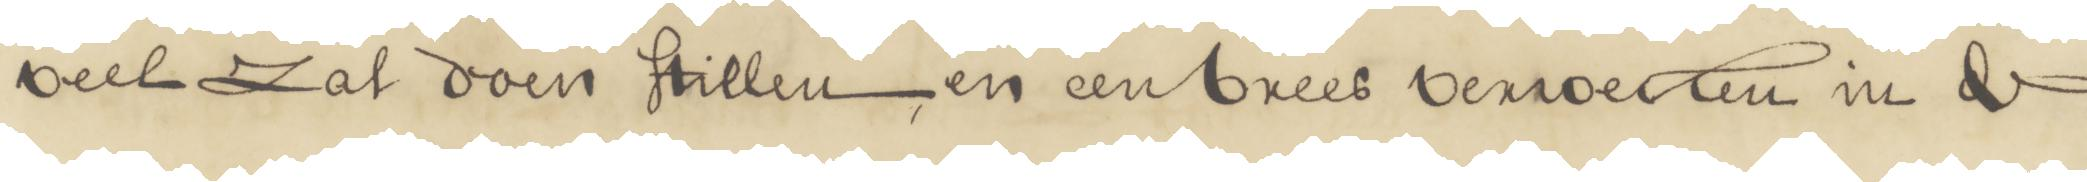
veel zal doen stillen, en een vrees verwecken in de
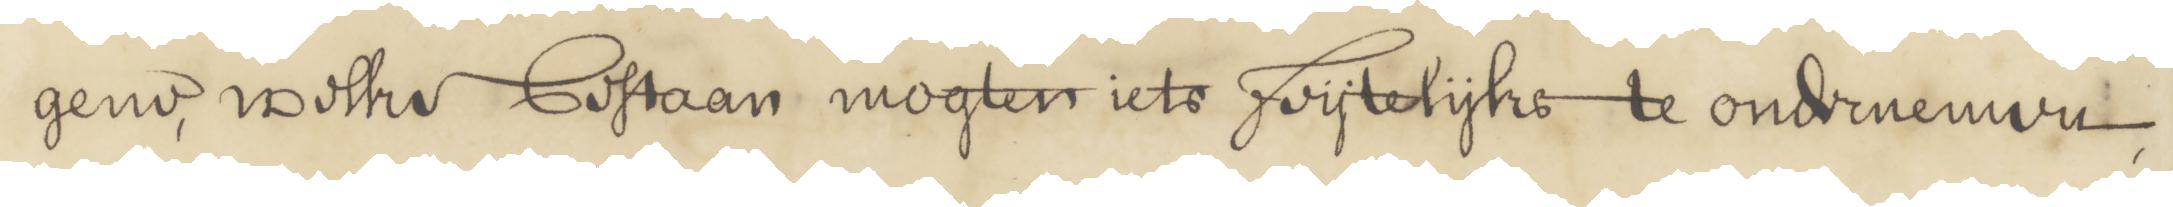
gene, welke bestaan mogten iets feijtelijks te ondernemen,
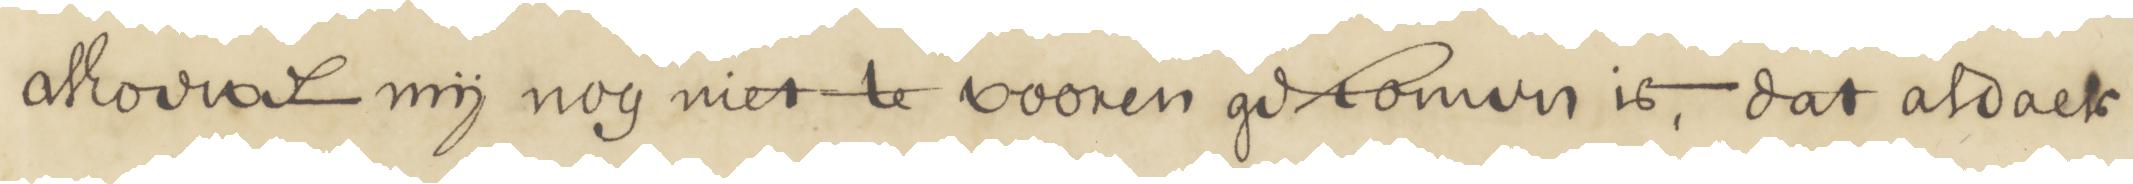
alhoewel mij nog niet te vooren gekomen is, dat aldaer
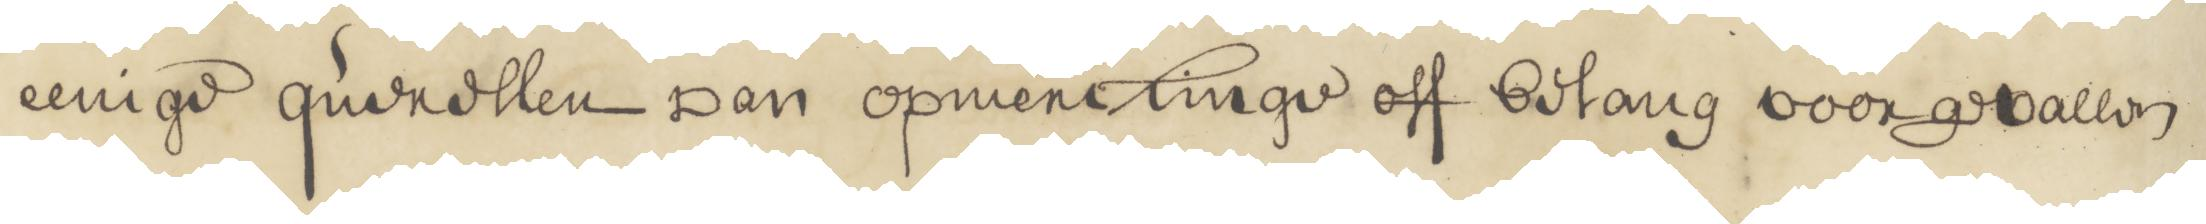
eenige querellen van opmerckinge off belang voor gevallen
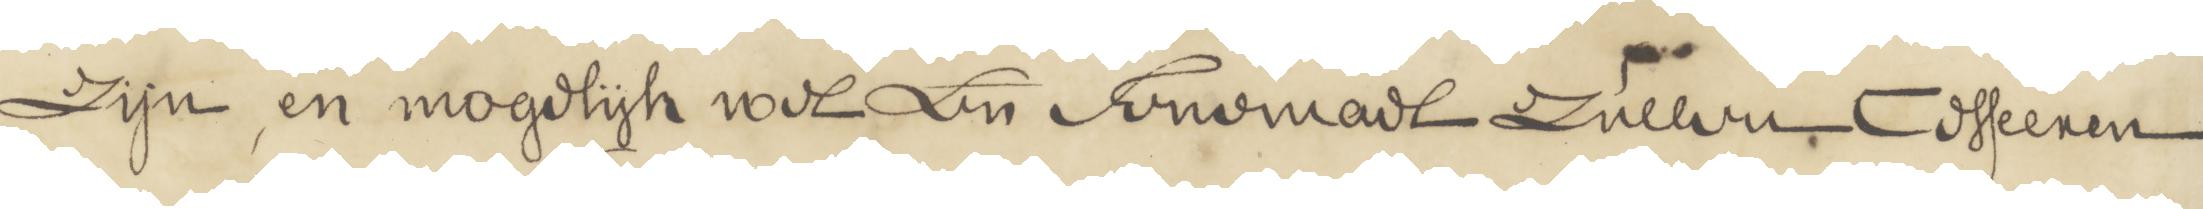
zijn, en mogelijk wel ten Eenemael zullen cesseeren
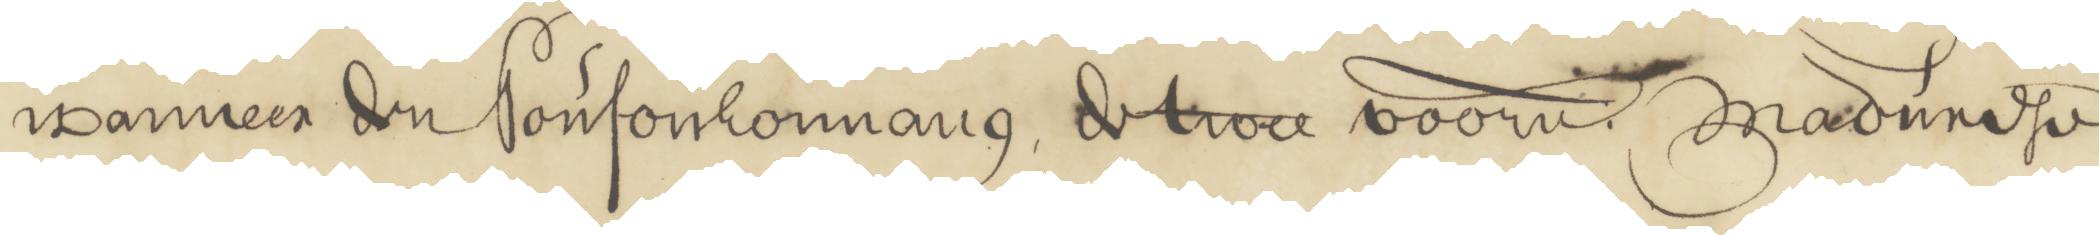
wanneer den sousouhounang, de twee voorn: madurese
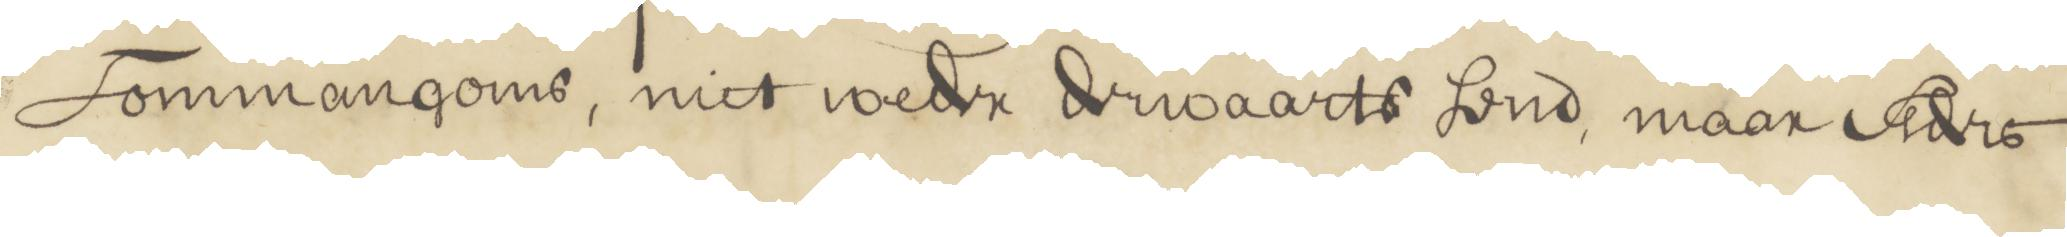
Tommangoms, niet weder derwaarts send, maar Eeders
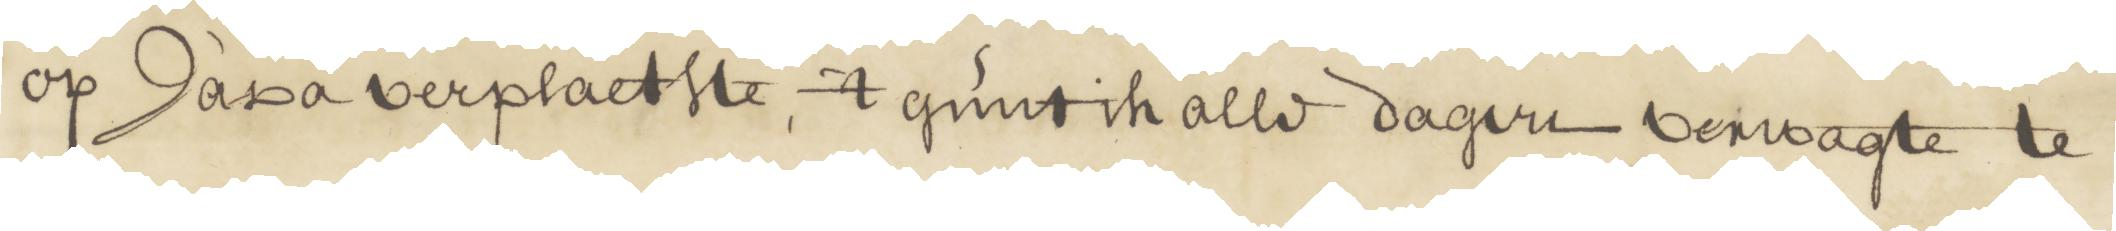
op Java verplaetste, ’t gunt ik alle dagen verwagte te
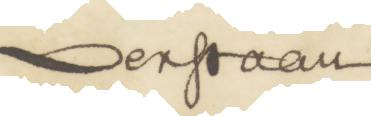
verstaan
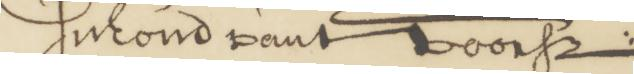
Jnhoud vant voorsz:
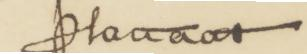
placcaat
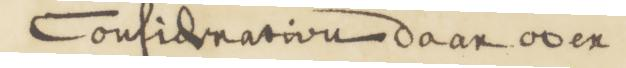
consideratien daar over
